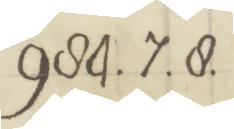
984.7.8.
